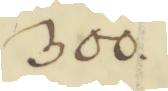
300.
